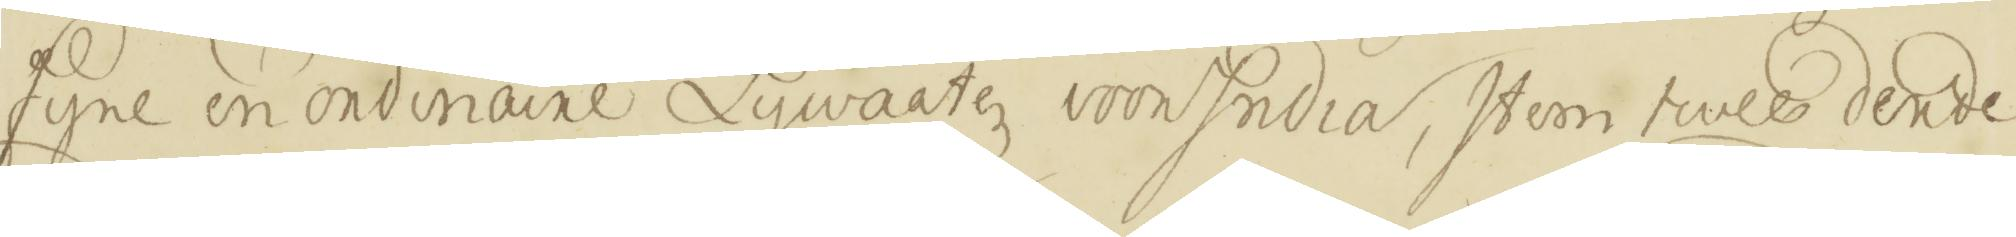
fyne en ondinaire Lywaaten voor Jndia, jtem twee derde
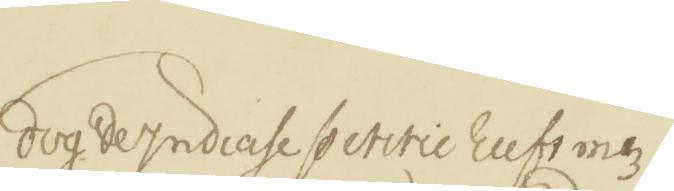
dog de jndiase petitie heeft men
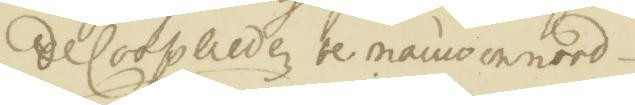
de Cooplieden te nauwernood
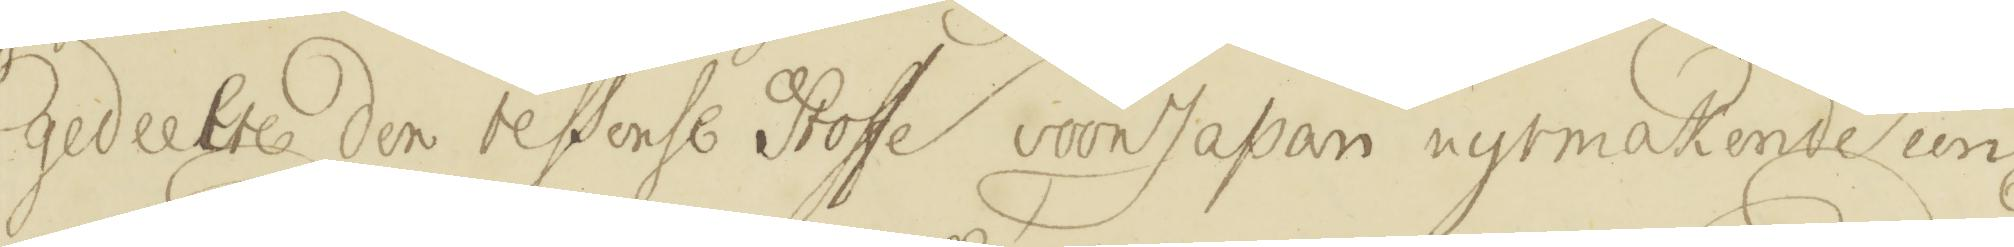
gedeelte der tesserse Hoffe voor Japan uytmakende een
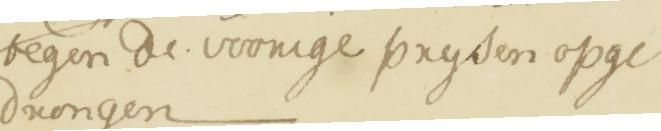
tegen de voorige prysen opge
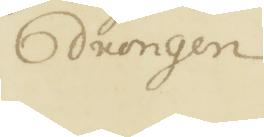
drongen
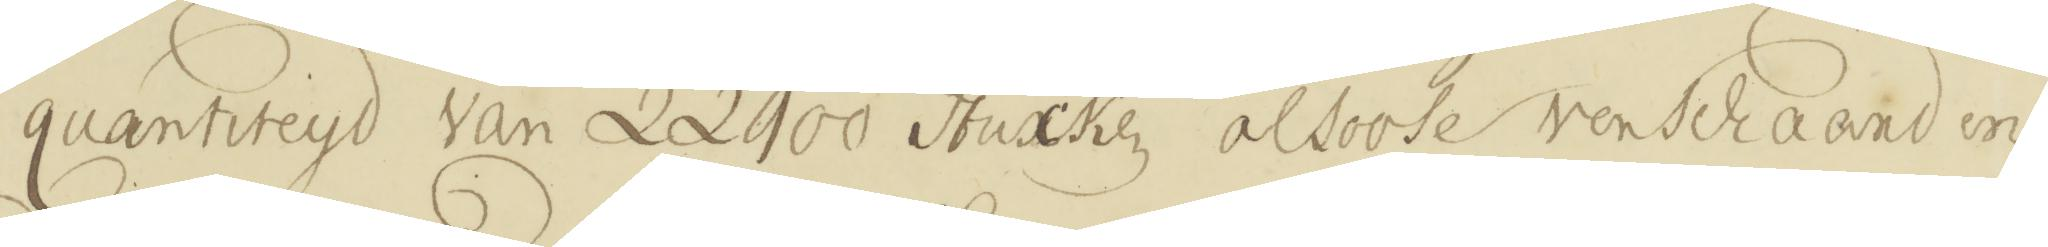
quantiteyd van 22400 stukken alsoo se verschaard en
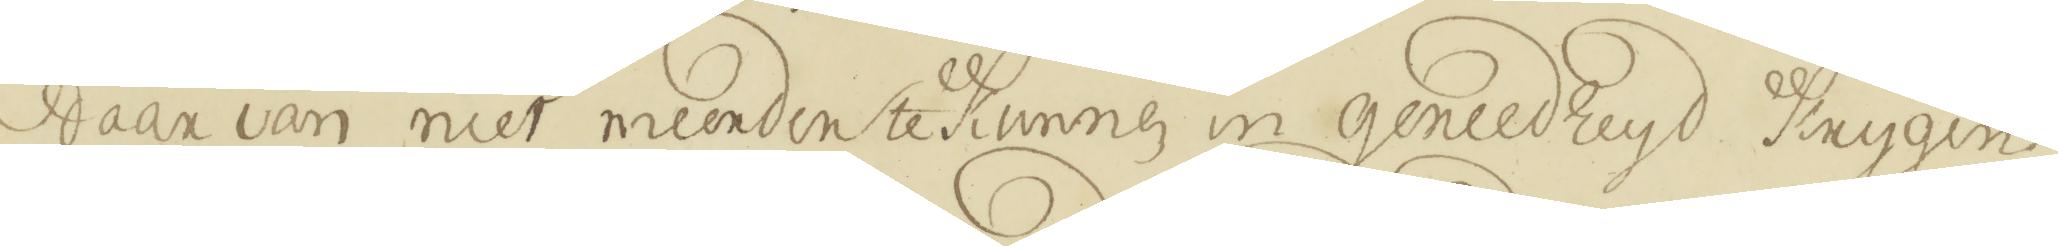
daar van niet meerden te kunnen in gereedheyd krygen
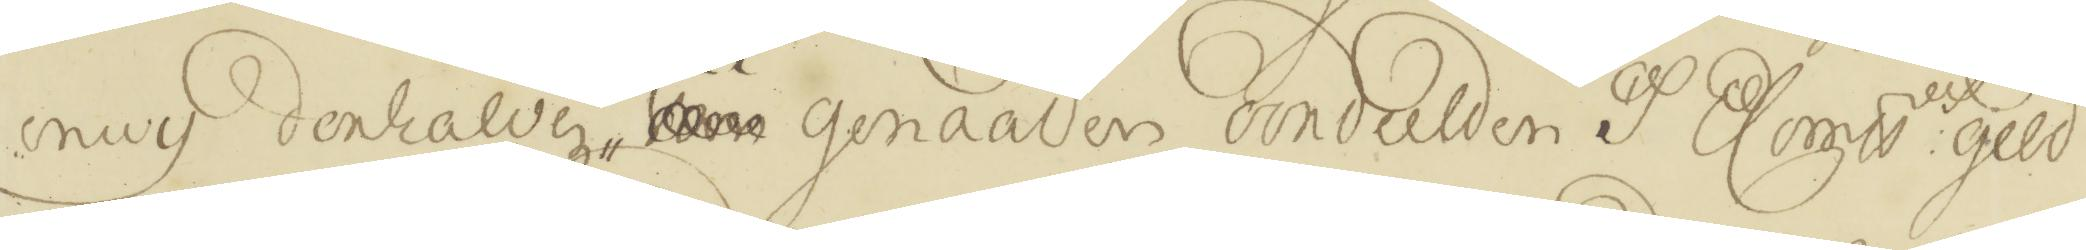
en wy derhalven „ van genaaden oordelden 'S EComp:es geld
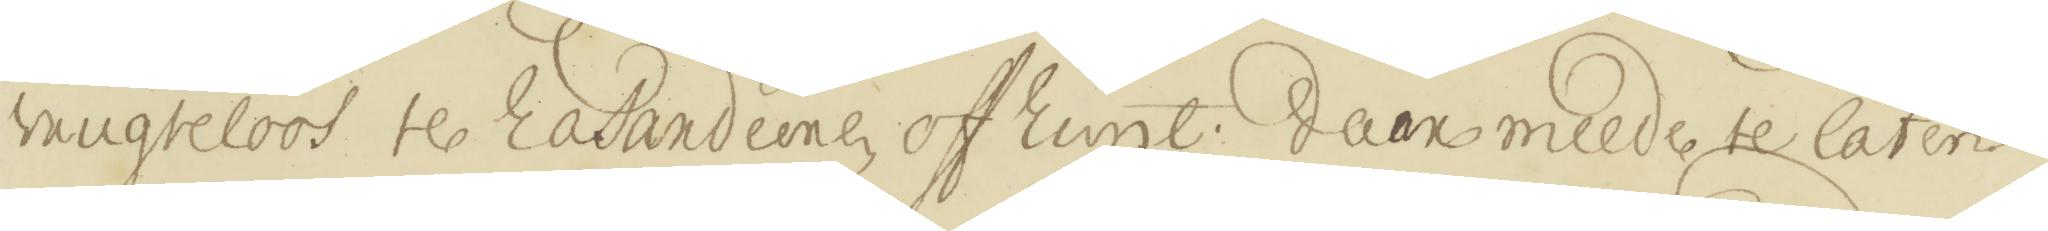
vrugteloos te hasardeeren off hun l: daar meede te laten
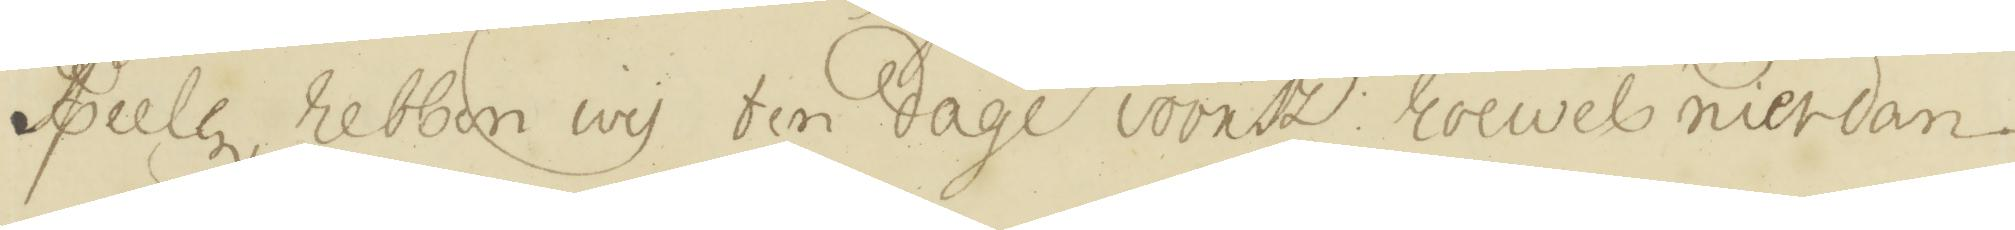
speelen, hebben wij ten dage voorsz: hoewel niet dan
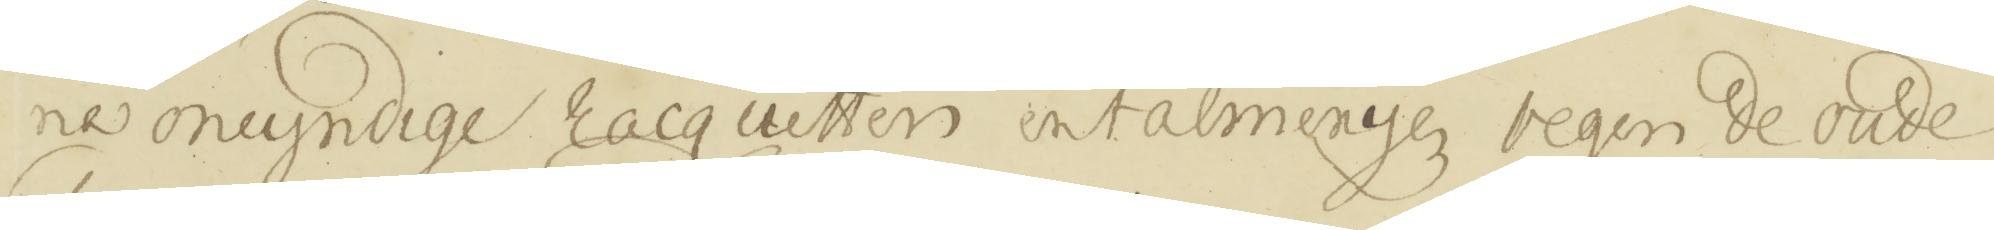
na oneyndige hacquetten en talmerijen tegen de oude
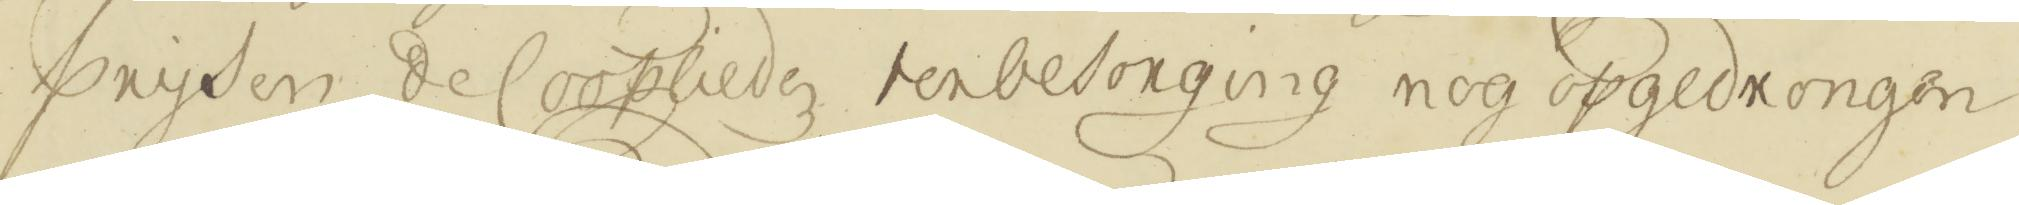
prijsen de Cooplieden ter besorging nog opgedrongen
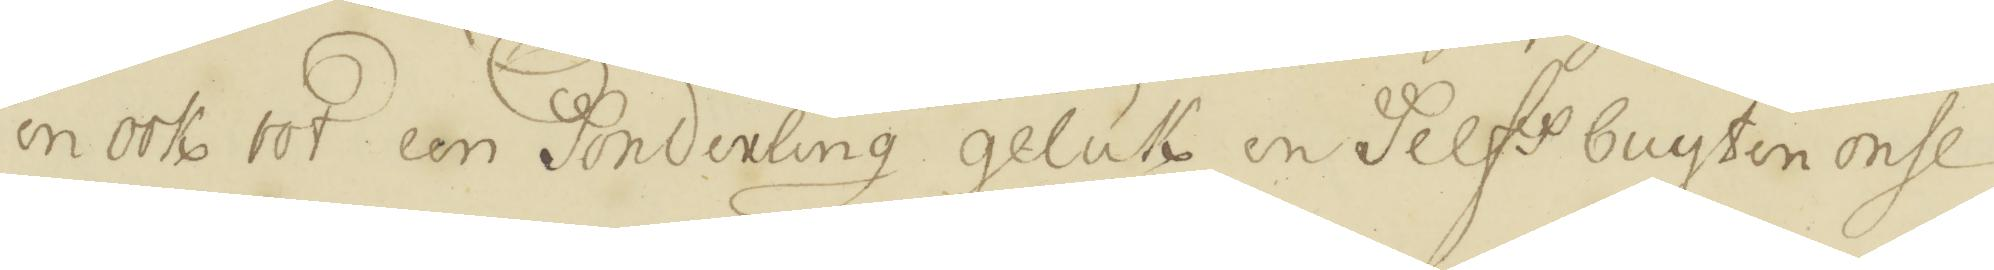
en ook tot een sonderling geluk en selfs buyten onse
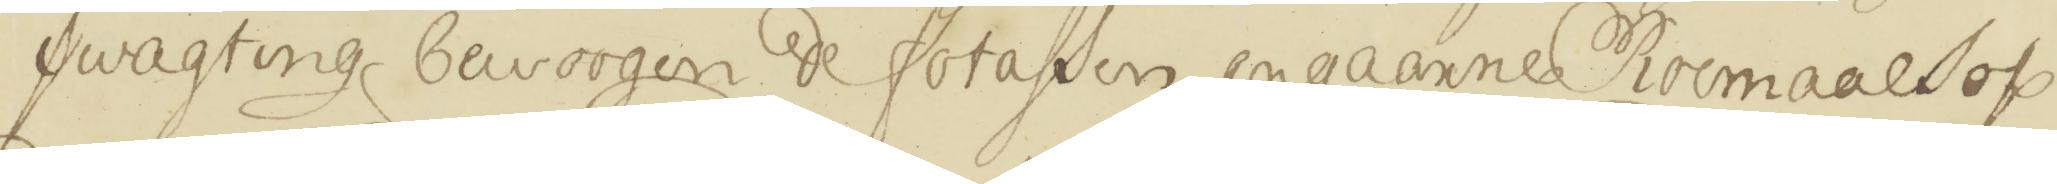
verwagting bewoogen de fotassen en gaarne Roemaals op
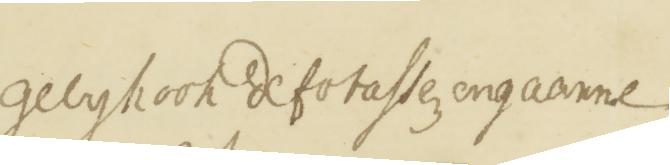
gelyk ook de fotassen en gaarne
